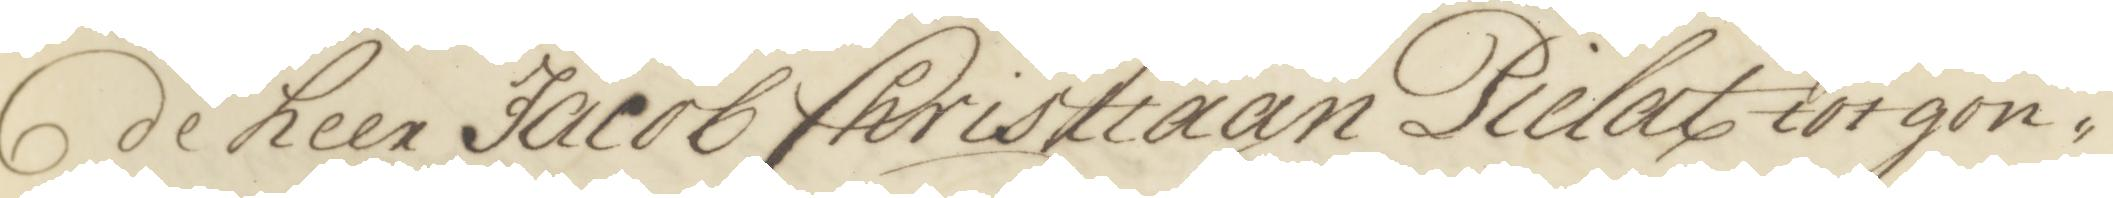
de heer Jacob Christiaan Pielat tot gou„
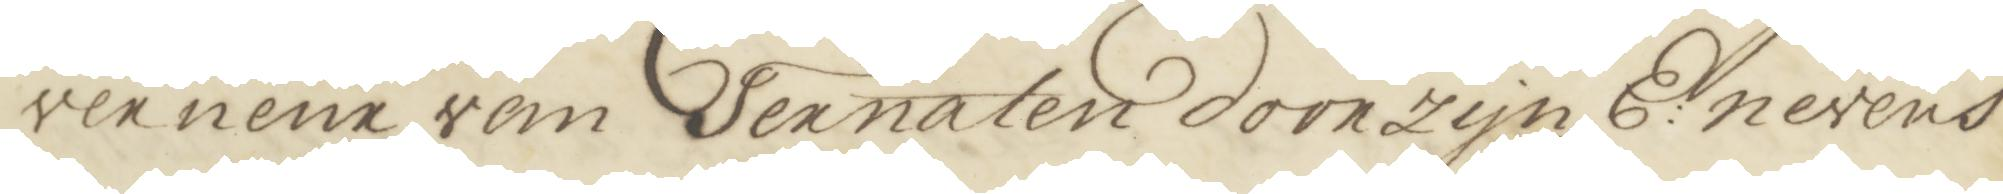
verneur van Ternaten door zijn E: nevens
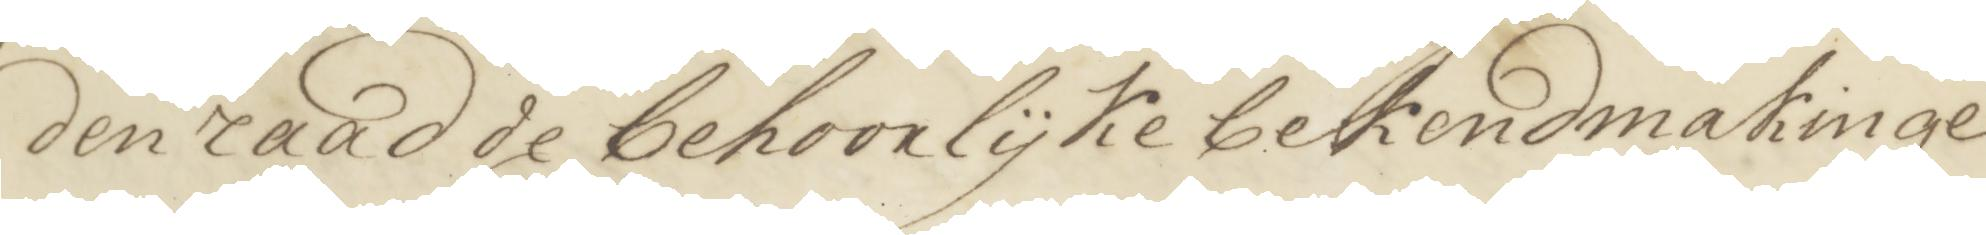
den raad de behoorlijke bekendmakinge
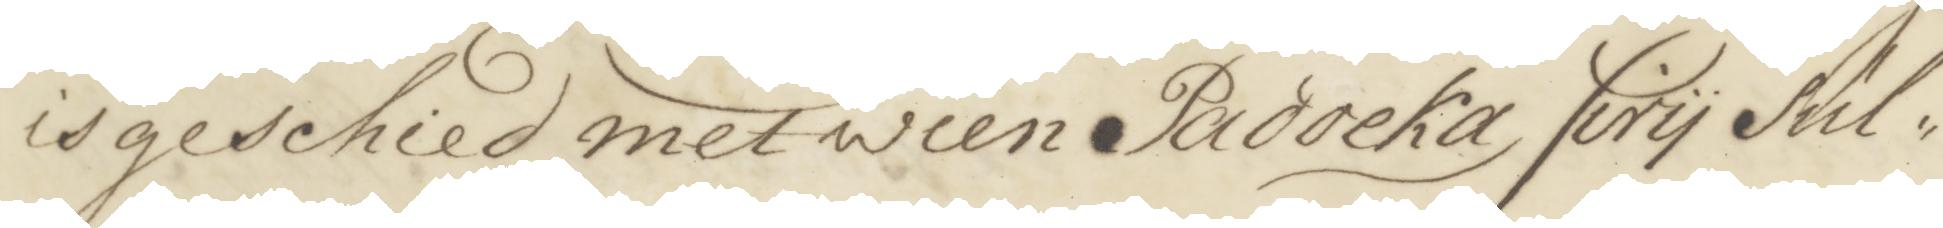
is geschied met wien Padoeka, Sirij Sul„
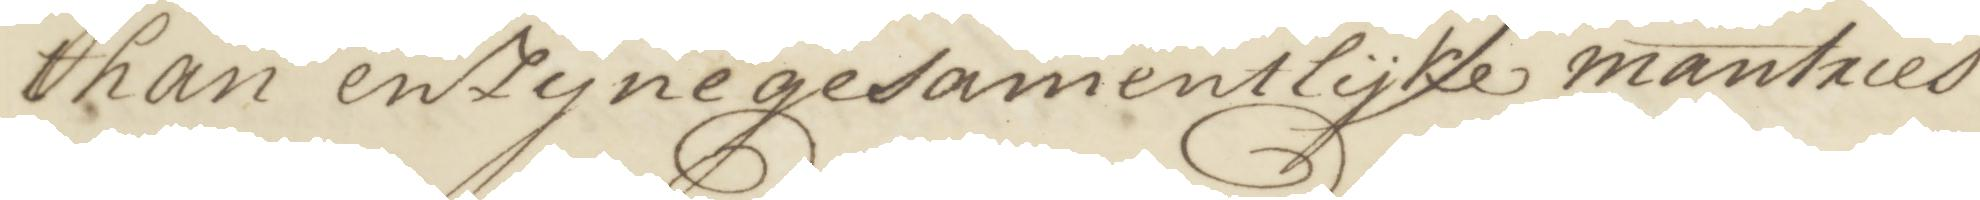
than en Zijne gesamentlijke mantries
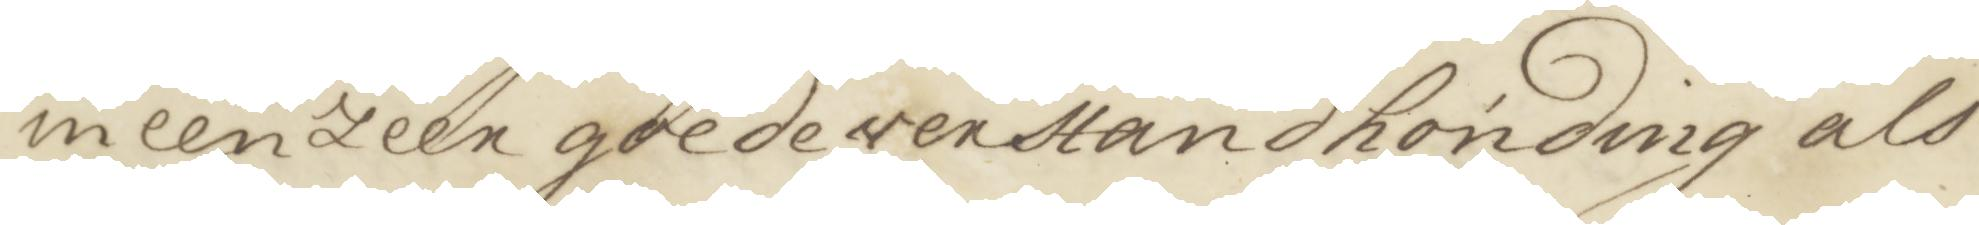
in een zeer goede verstandhouding als
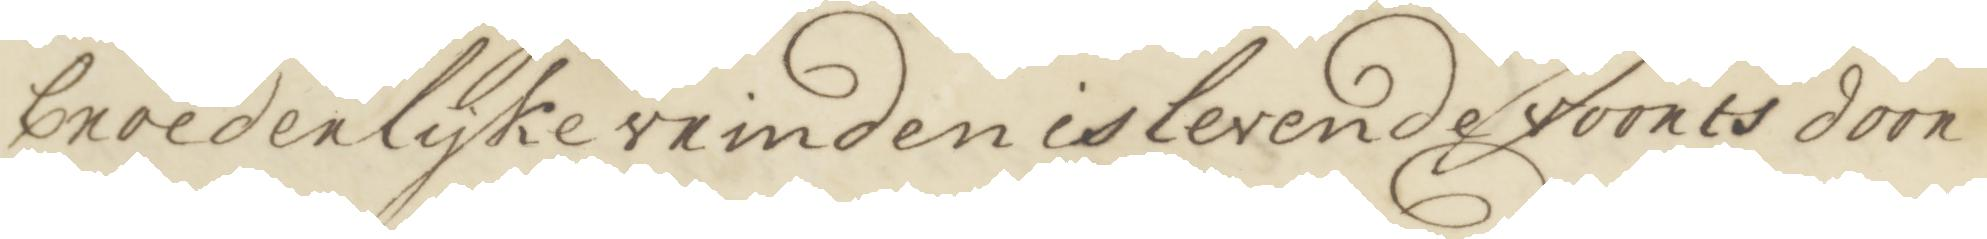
broederlijke vrinden is levende voorts door
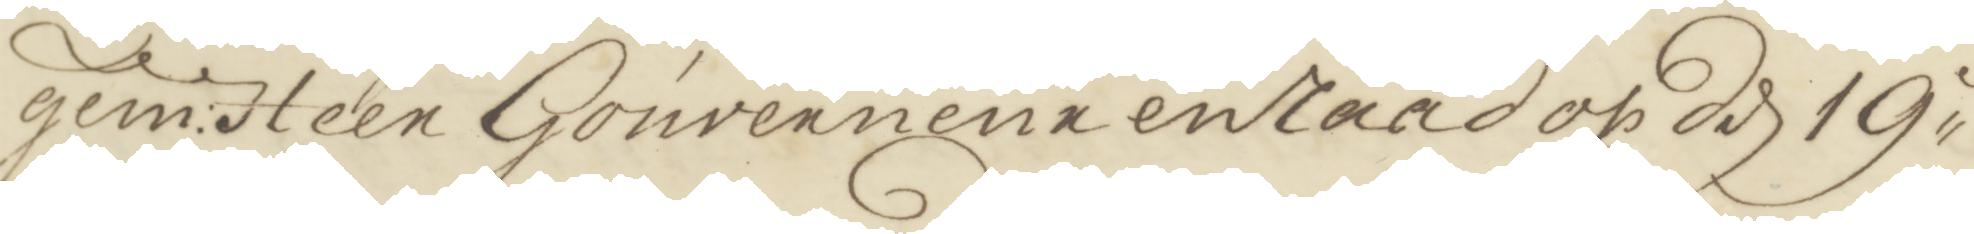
gem: Heer Gouverneur en Raad op den 19„e
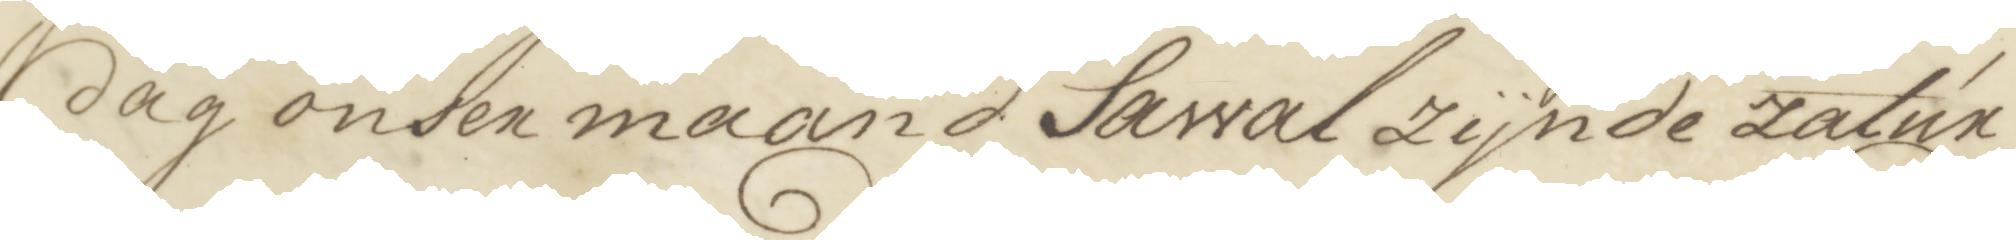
dag onser maand Sawal zijn de zatur
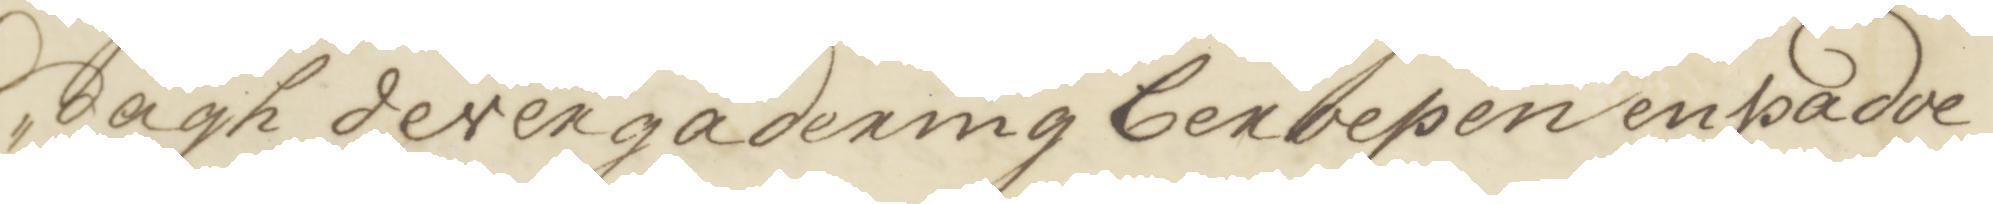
„dagh de vergadering beroepen en padoe
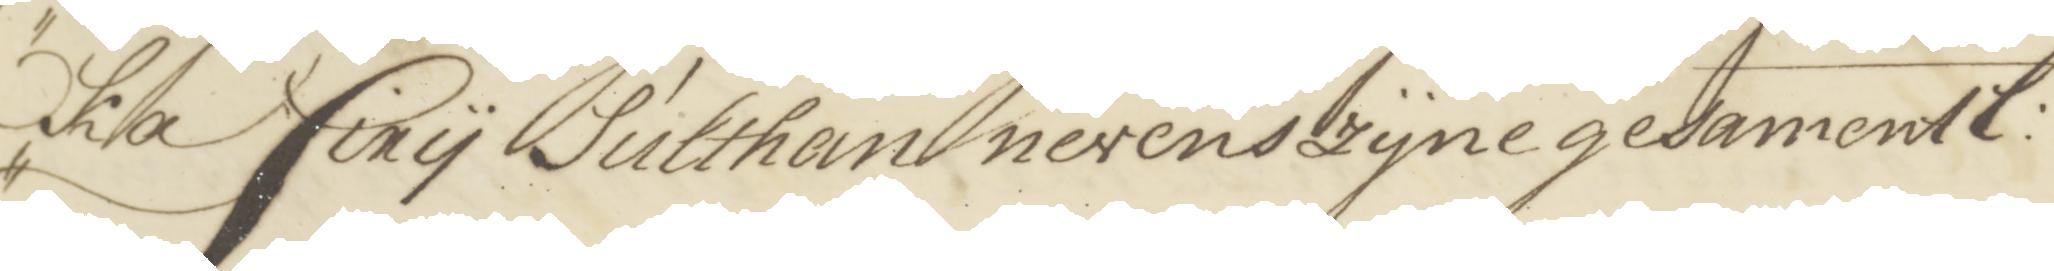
„ka Sirij Sulthan nevens zijne gesamentl:
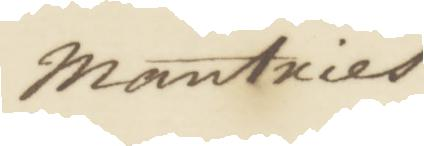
Mantries
